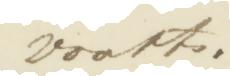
voorts.
